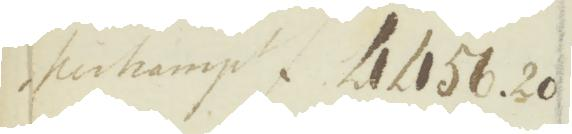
per transpt ƒ 4456.20
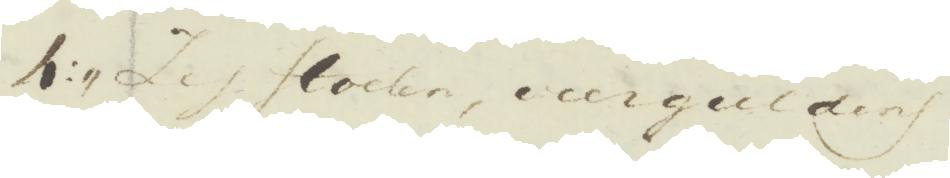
4:„ Zes stoelen, vier guldens
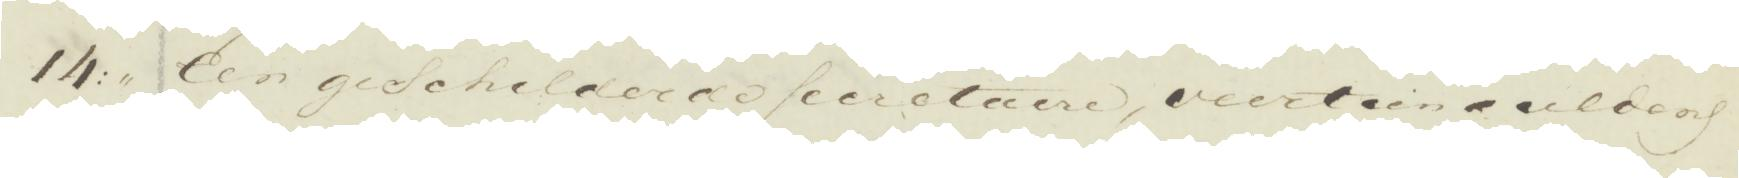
14: „ Een geschilderde secretaire, veertien guldens
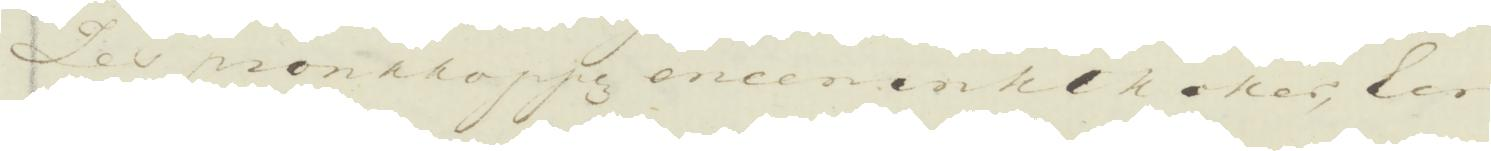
Zes pronkkoppen en een inktkoker, Een
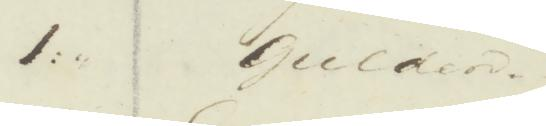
1.„ Gulden.
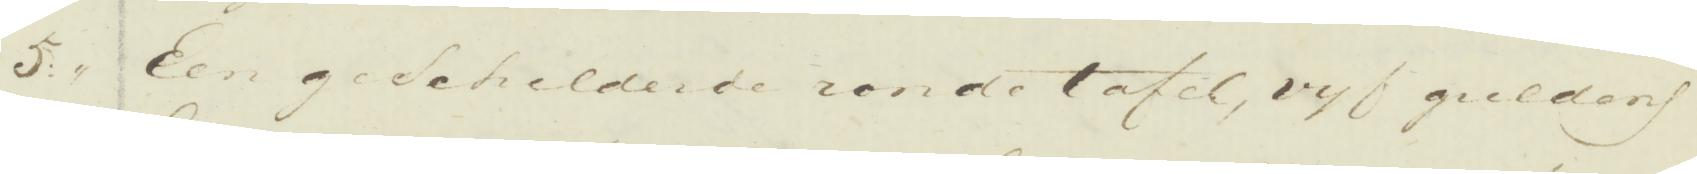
5:„ Een geschilderde ronde tafel, vyf guldens
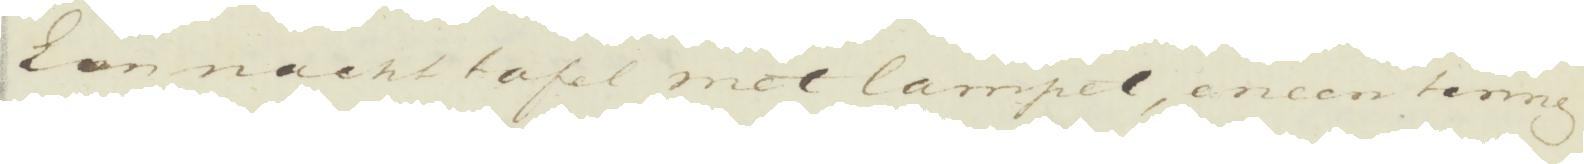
Een nachttafel met lampet, en een tinnen
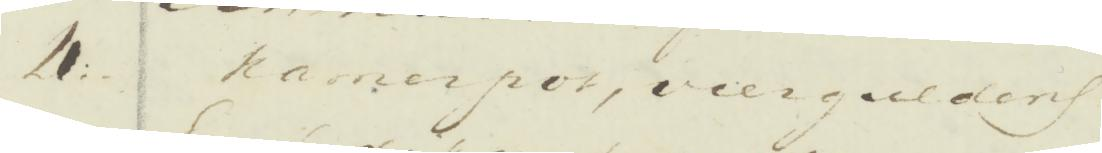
4:„ kamerpot, vier guldens
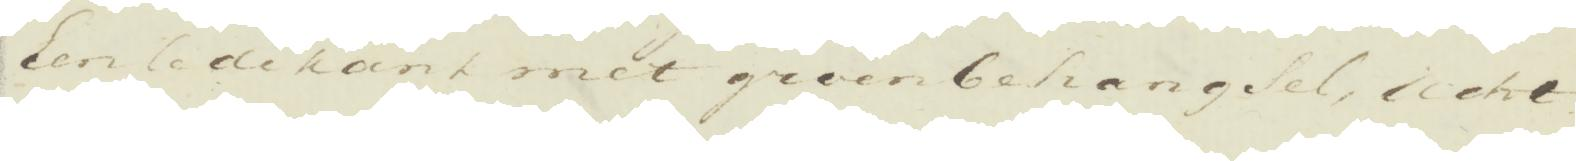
Een ledikant met groen behangsel, acht
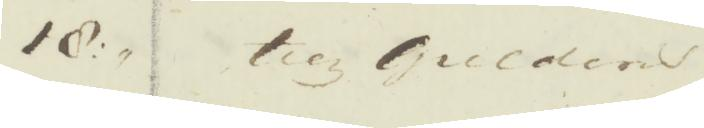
18.„ tien Guldens
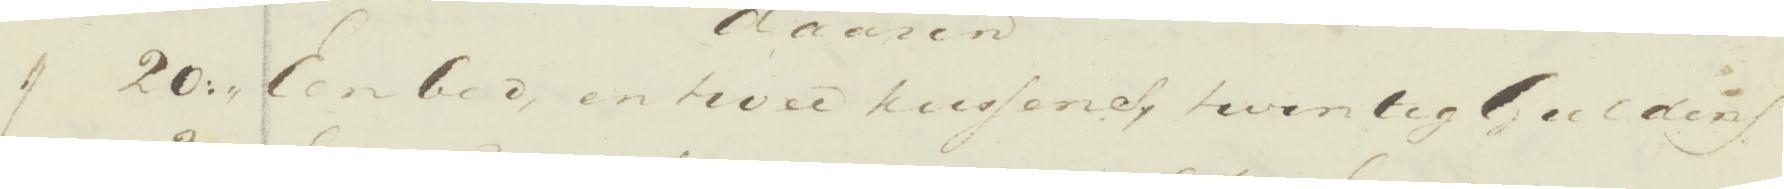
„ 20:„ Een bed, en twee kussens, twintig Guldens
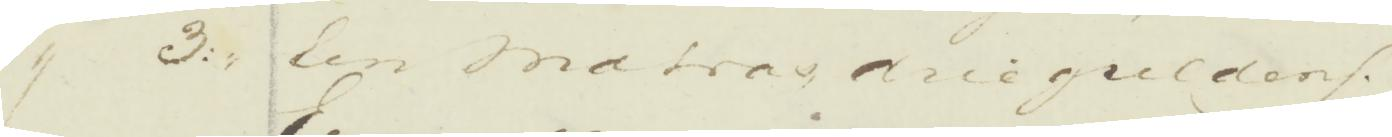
„ 3:„ Een Matras, drie guldens.
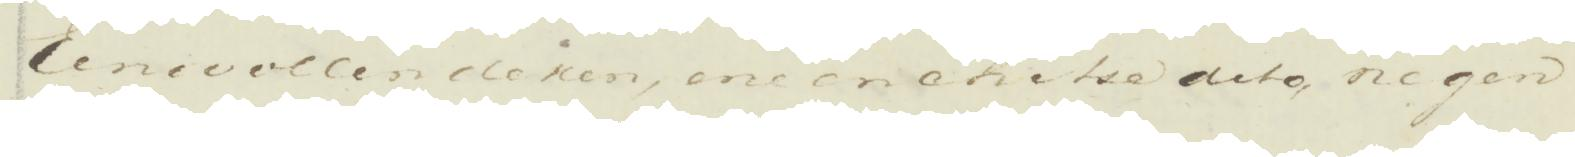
Een wollen deken, eneen chitse dito, negen
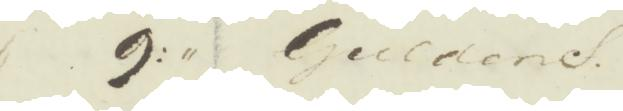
9:„ Guldens.
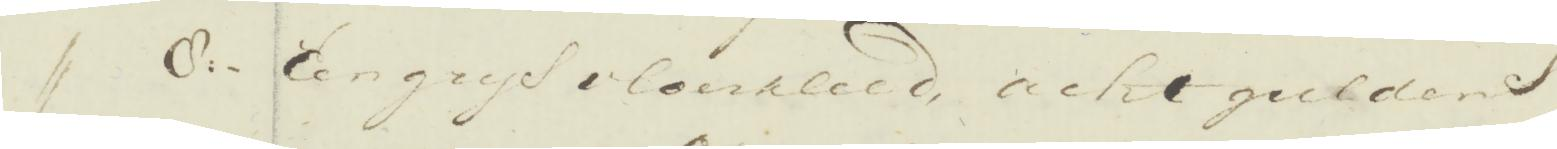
„ 8:- Een grys vloerkleed, acht guldens
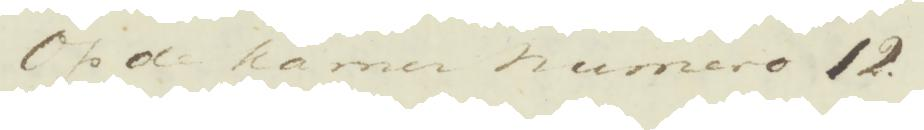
Op de kamer numero 12.
